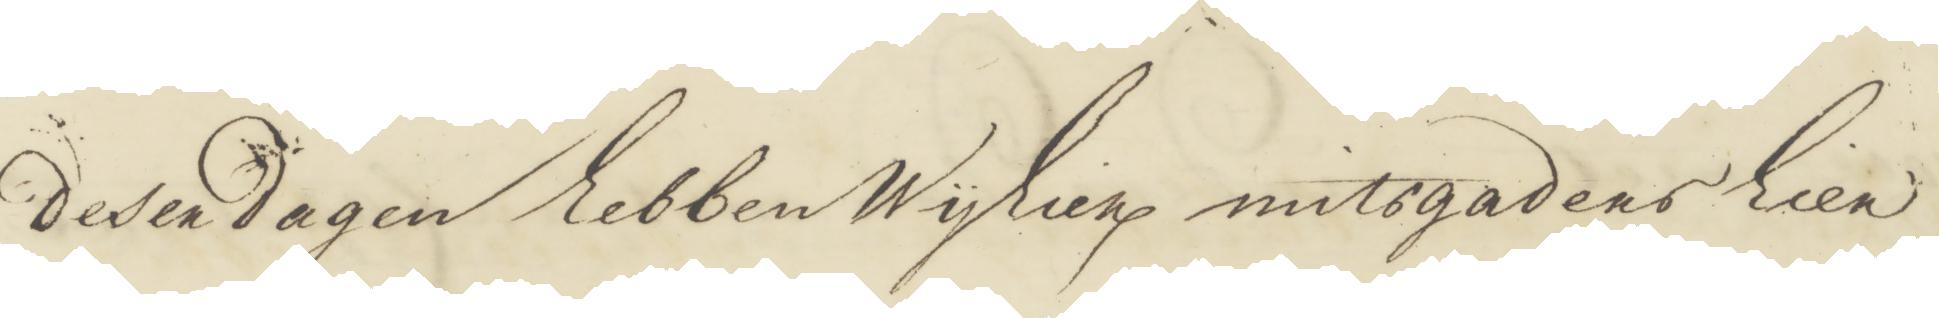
deser dagen hebben wij hier mitsgaders hier
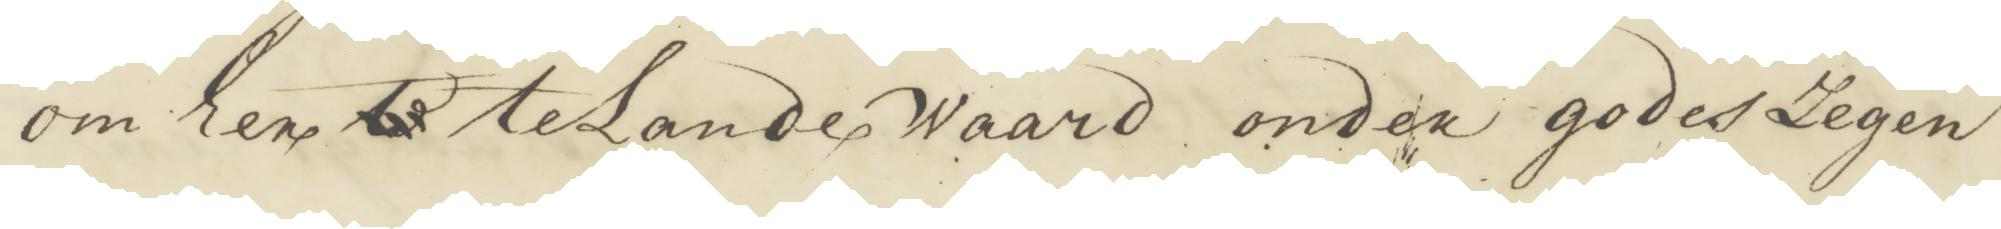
om her te telande waard onder godes zegen
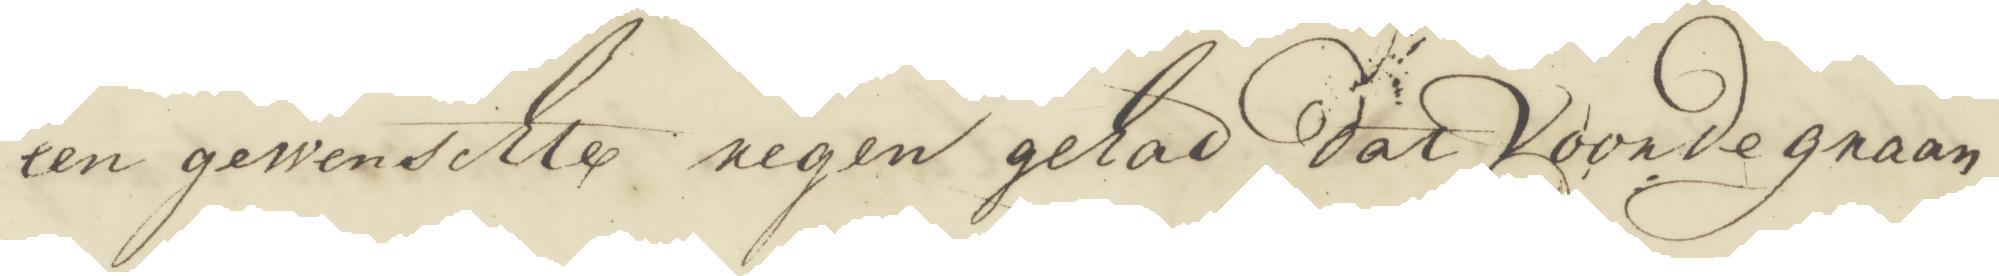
een gewenschte regen gehad dat voor de graan
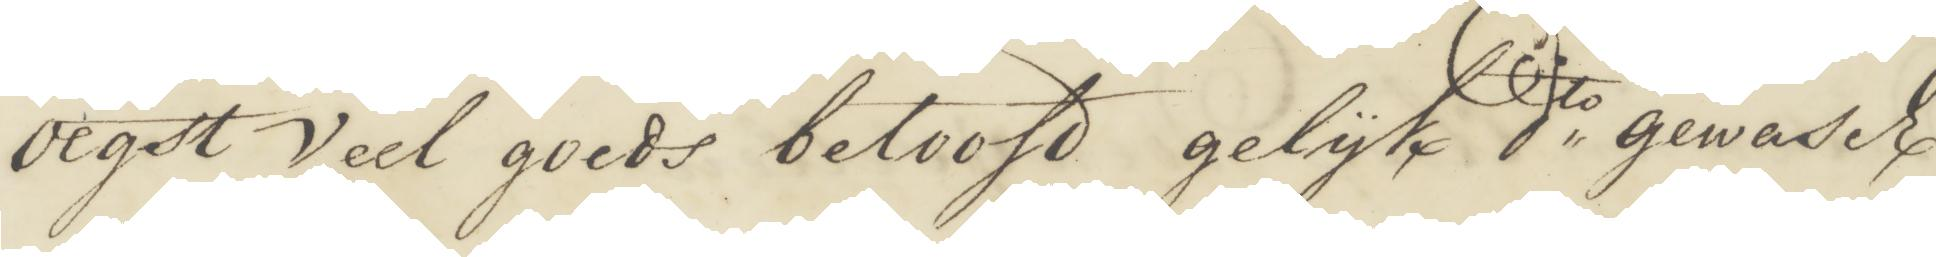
oegst veel goeds betoofd gelijk d„to gewasch
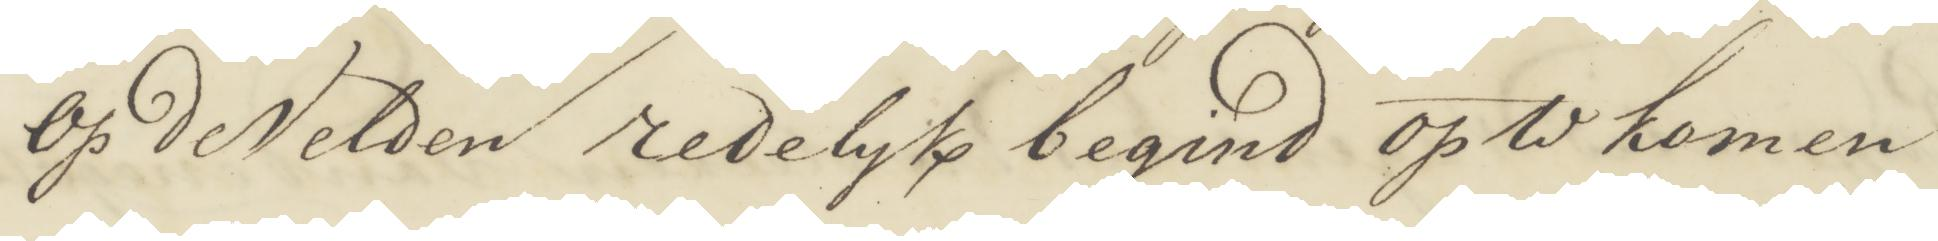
op develden redelyk begind op te komen
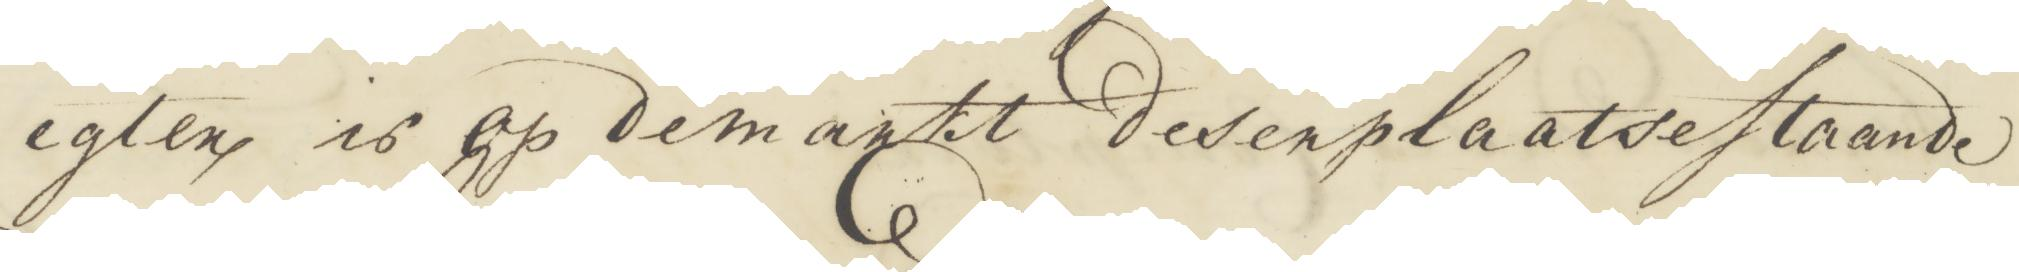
egter is op de markt deser plaatse staande
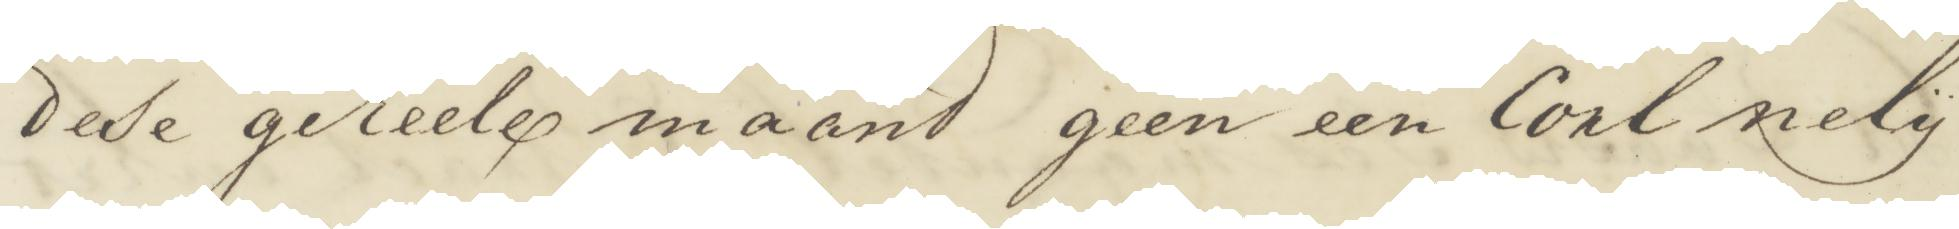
dese geheele maand geen een Corl nelij
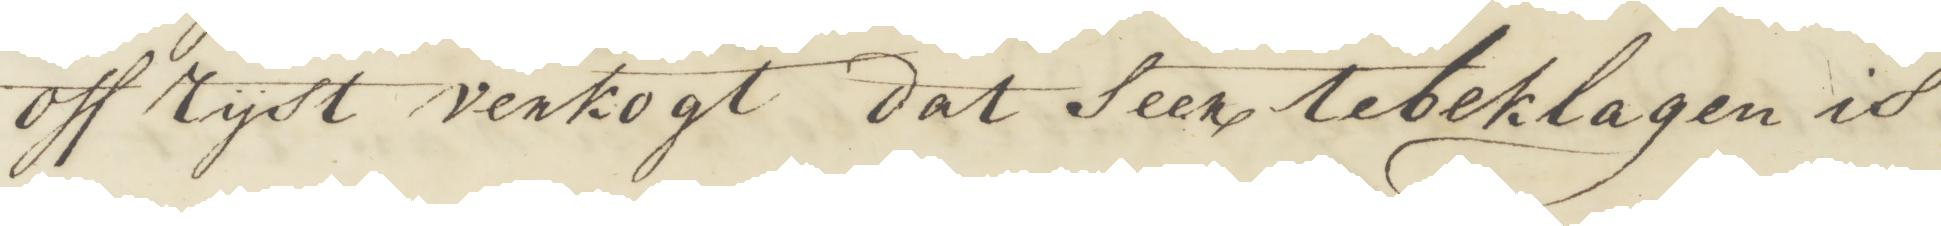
off rijst verkogt dat seer tebeklagen is
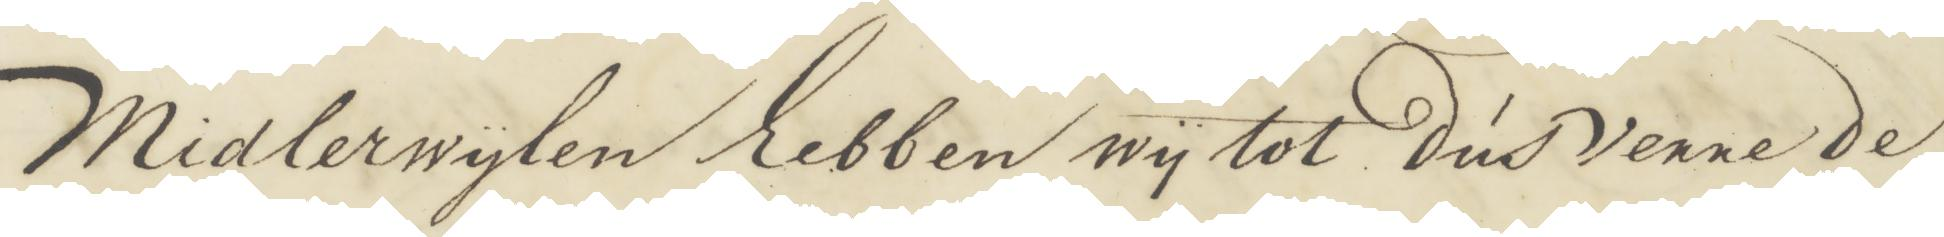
Midlerwijlen hebben wij tot dus verre de
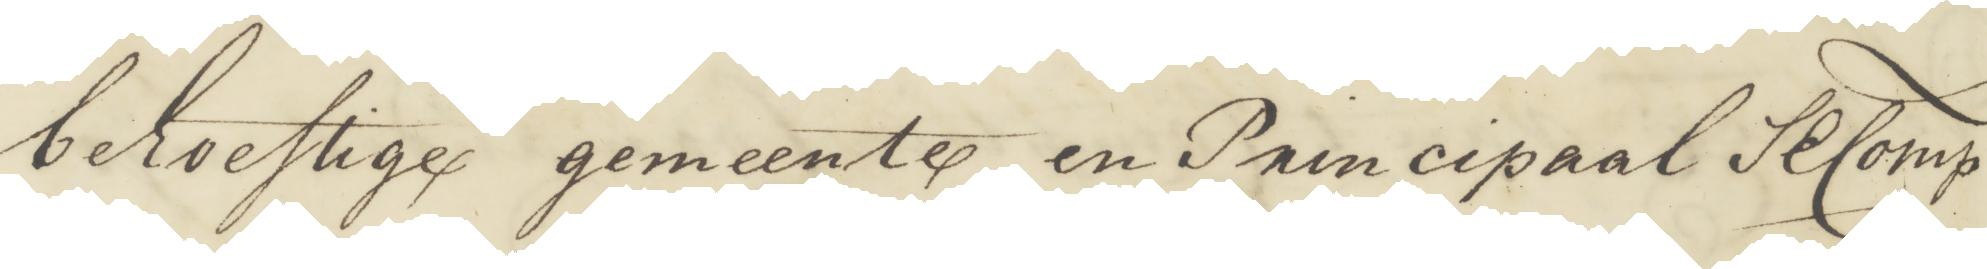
behoeftige gemeente en Principaal sEComp
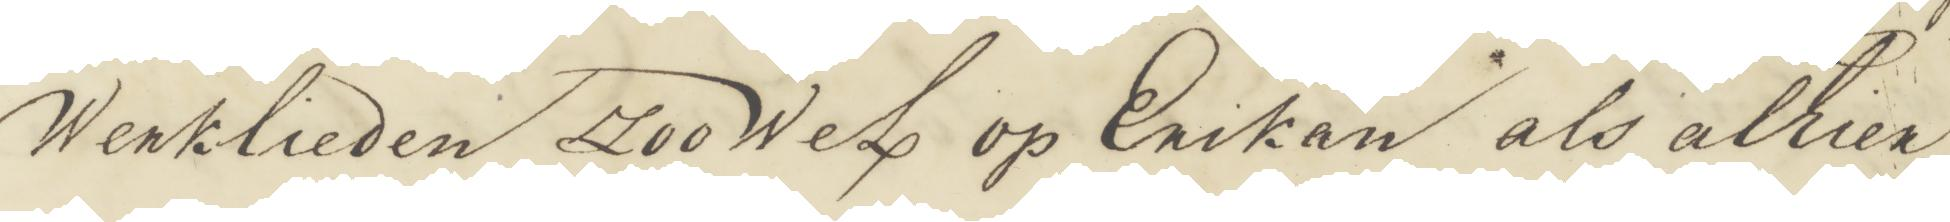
werklieden zoo wel op Erikan als alhier
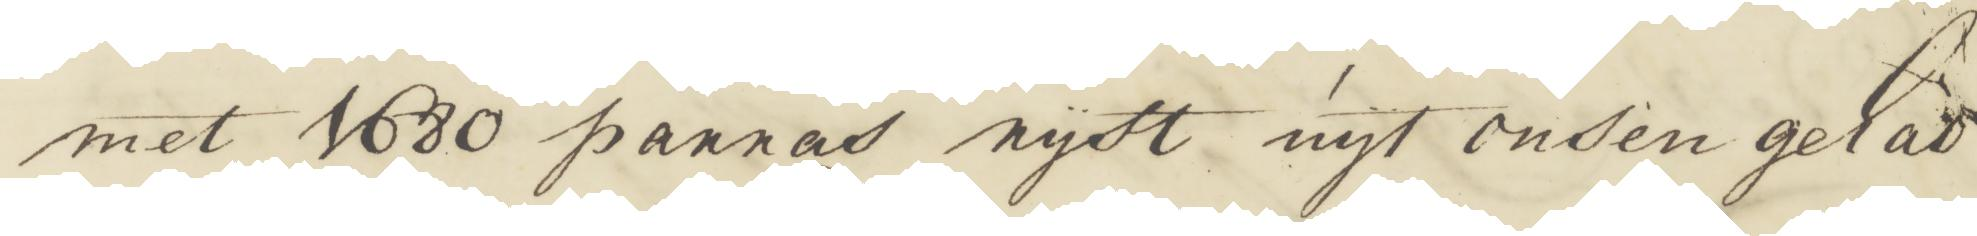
met 1680 parras rijst uijt onsen gehad
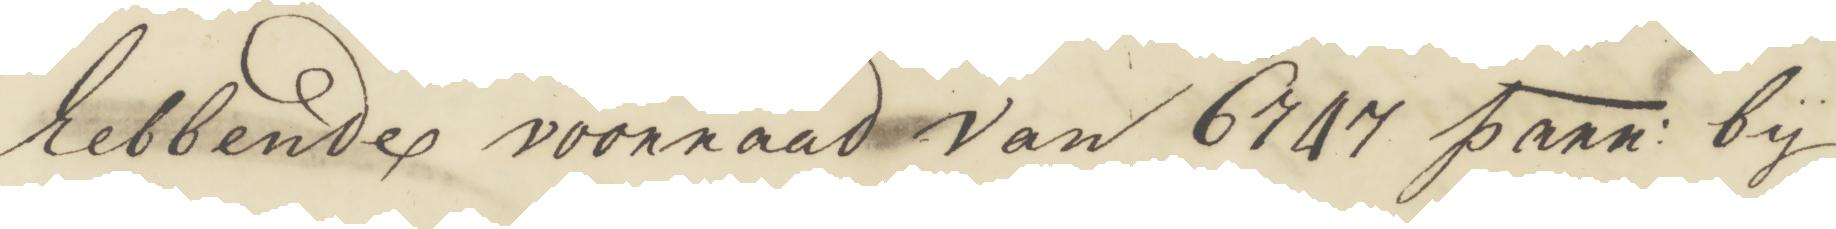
hebbende voorraad van 6747 parr: bij
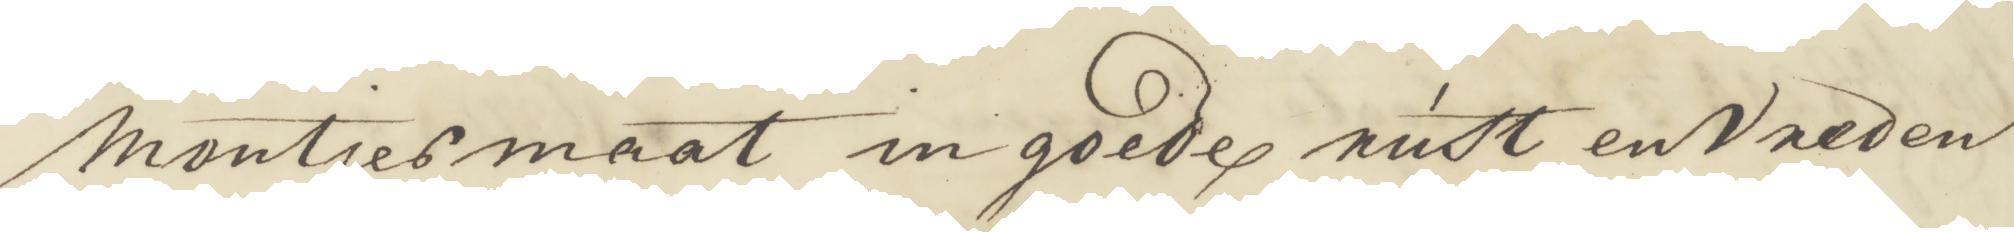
montjes maat in goede rust en vreden
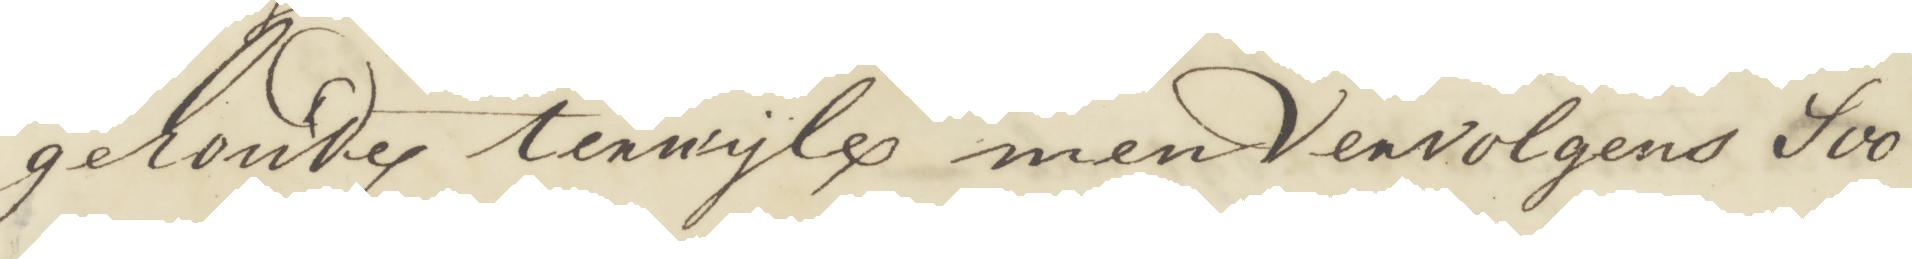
gehoude terwijle men vervolgens soo
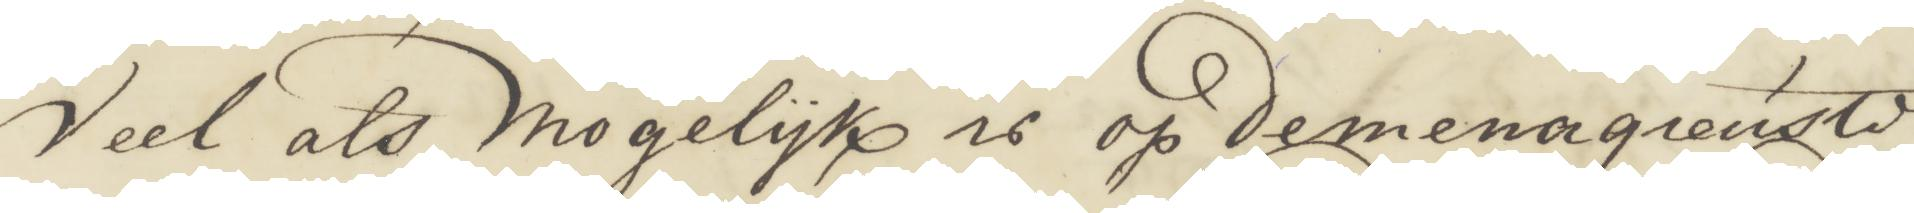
veel als mogelijk is op demenagieuste
